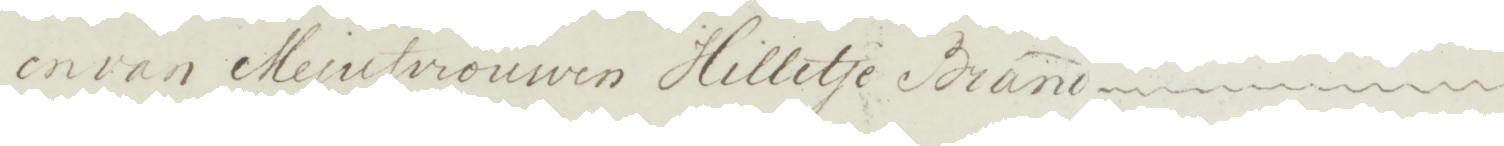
en van Mejufvrouwen Hilletje Brand
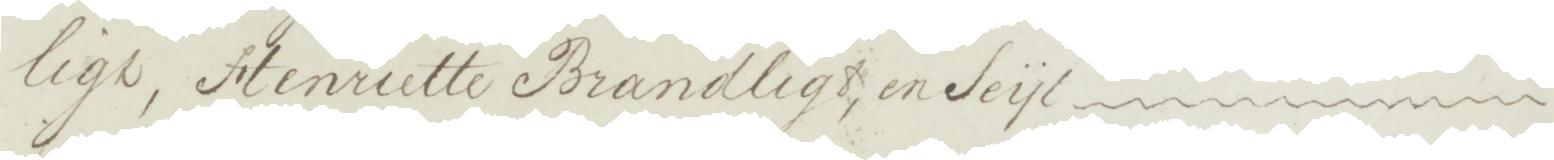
ligt, Henriette Brandligt, en Seijt
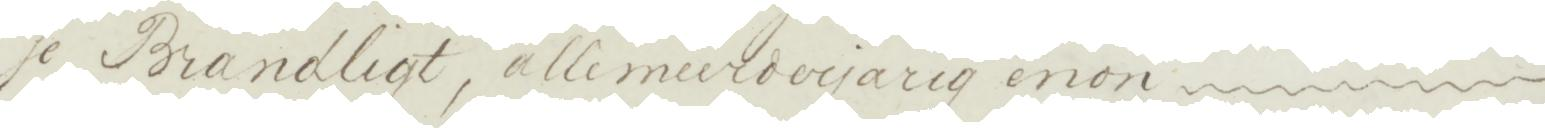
je Brandligt, alle meerderjarig en on
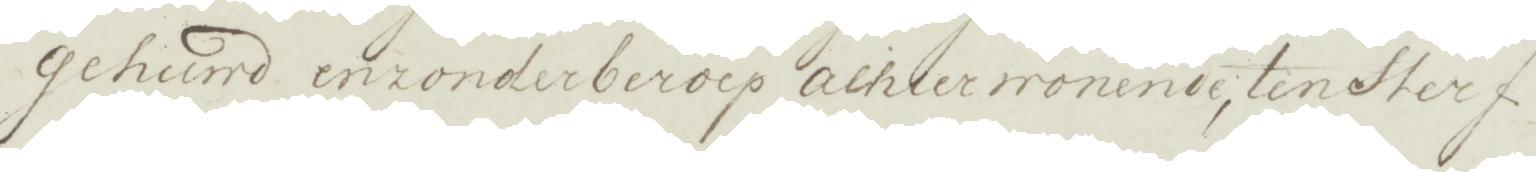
gehuwd en zonder beroep alhier wonende, ten sterf
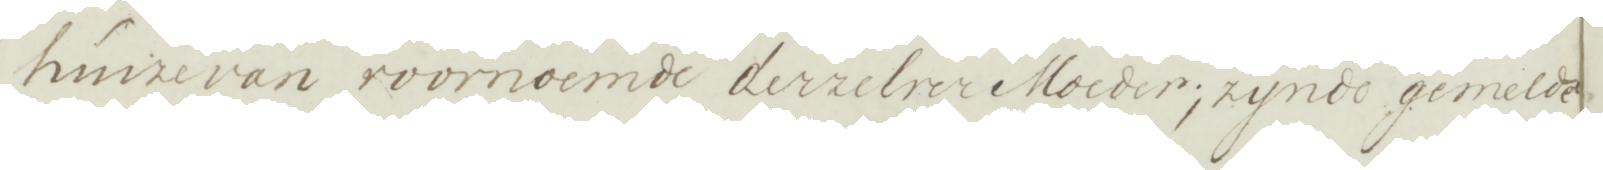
huize van voornoemde derzelver Moeder, zijnde gemelde
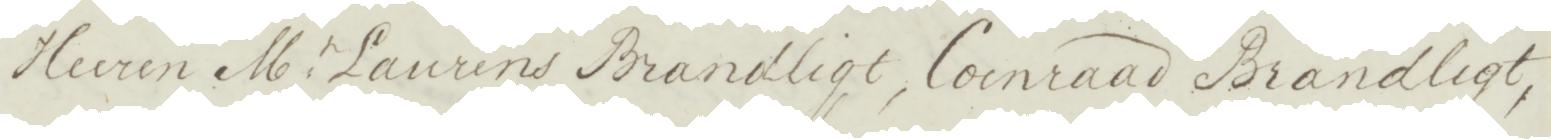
Heeren M:r Laurens Brandligt, Coenraad Brandligt,
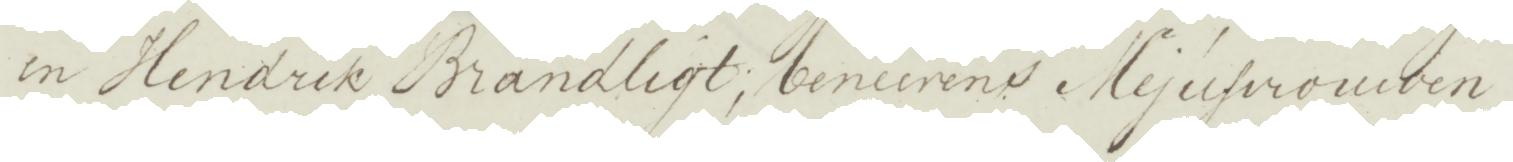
en Hendrik Brandligt, beneevens Mejufvrouwen
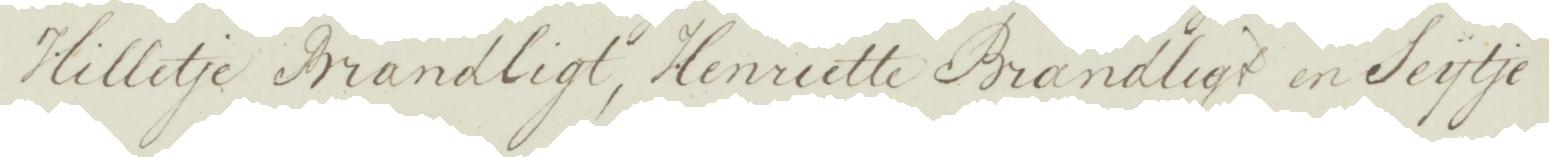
Hilletje Brandligt, Henriette Brandligt en Seijtje
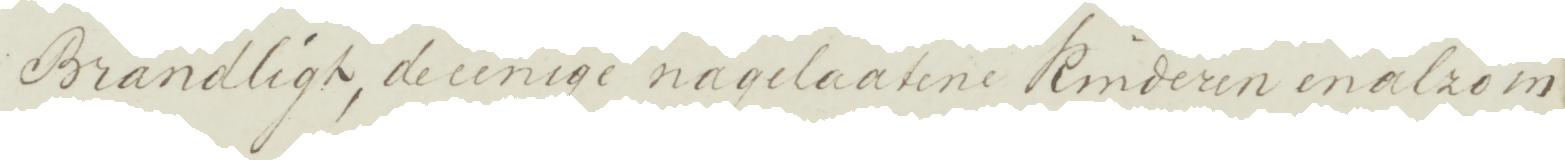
Brandligt, de eenige nagelaatene Kinderen en alzo in
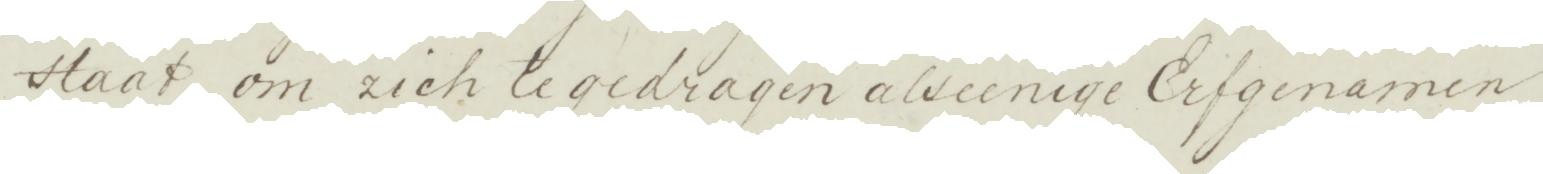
staat, om zich te gedragen als eenige Erfgenamen
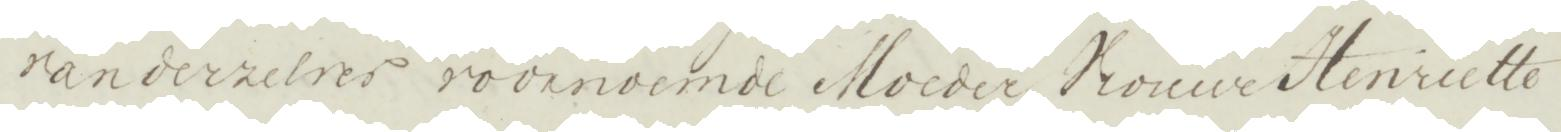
van derzelver voornoemde Moeder, Vrouwe Henriette
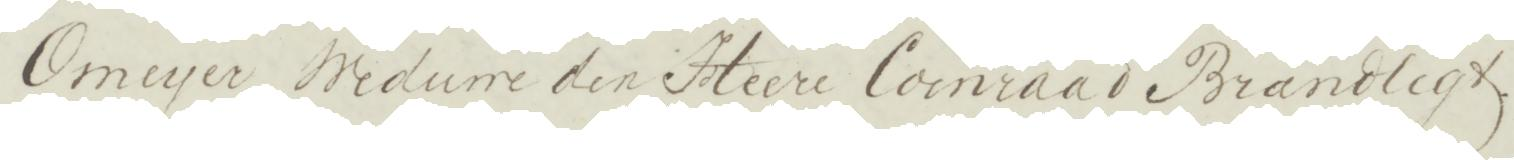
Omeijer, Weduwe den Heere Coenraad Brandligt
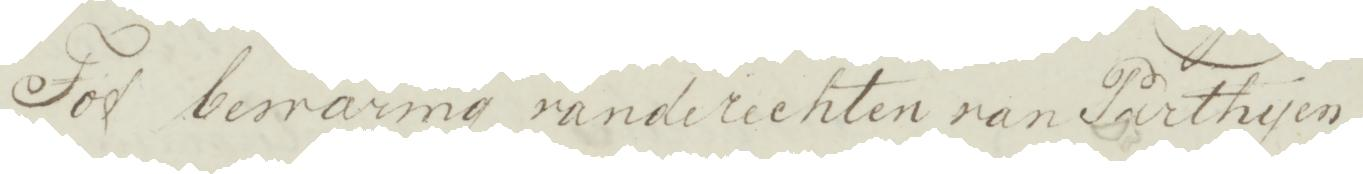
Tot bewaring vande rechten van Parthijen,
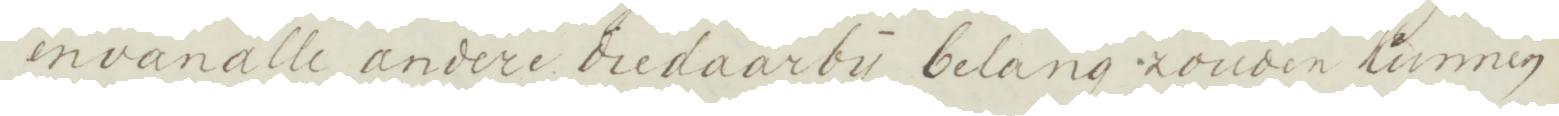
en van alle andere die daarbij belang zouden kunnen
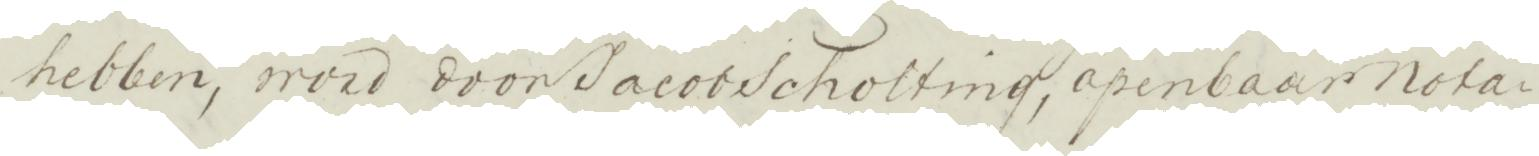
hebben, word door Iacob Scholting, openbaar Nota
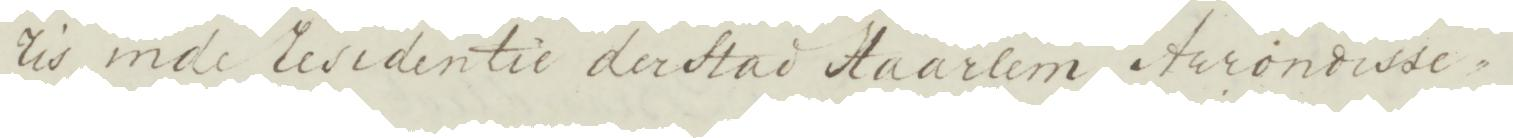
ris, inde residentie der stad Haarlem, Arrondisse„
